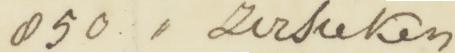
850 „ zirsieken
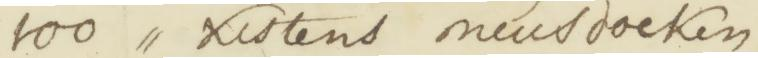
100 „ kistins neusdoeken
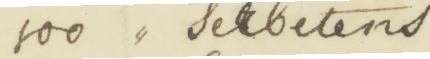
100 „ serbetens
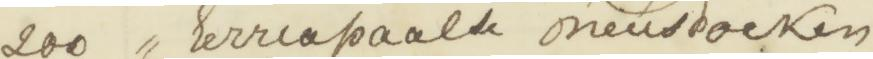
200 „ herriapaalse neusdoeken
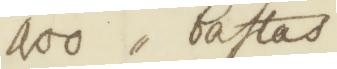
400 „ baftas
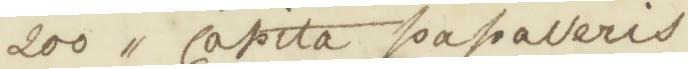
200 „ Capita papaveris
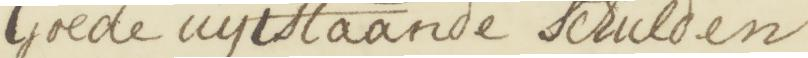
Goede uijtstaande schulden
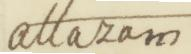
attazam
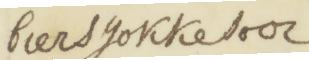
biers Jokkesoor
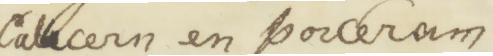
Calcern en porceram
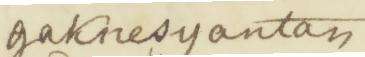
gaknesyantan
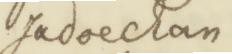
Jadoechan
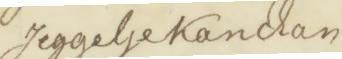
Jeggelje kanchan
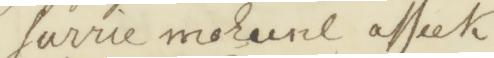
furrie moheenl asseek
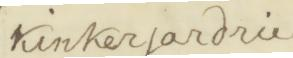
kinkerjardrie
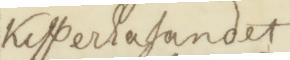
kipperhajandet
